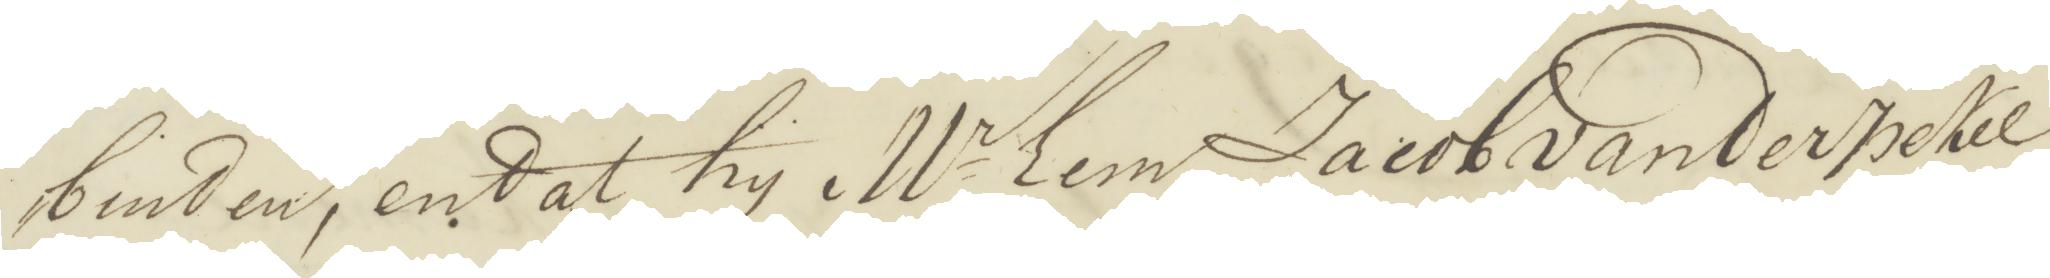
„binden en dat hij M=r hem, hem Iacob van der pekel,
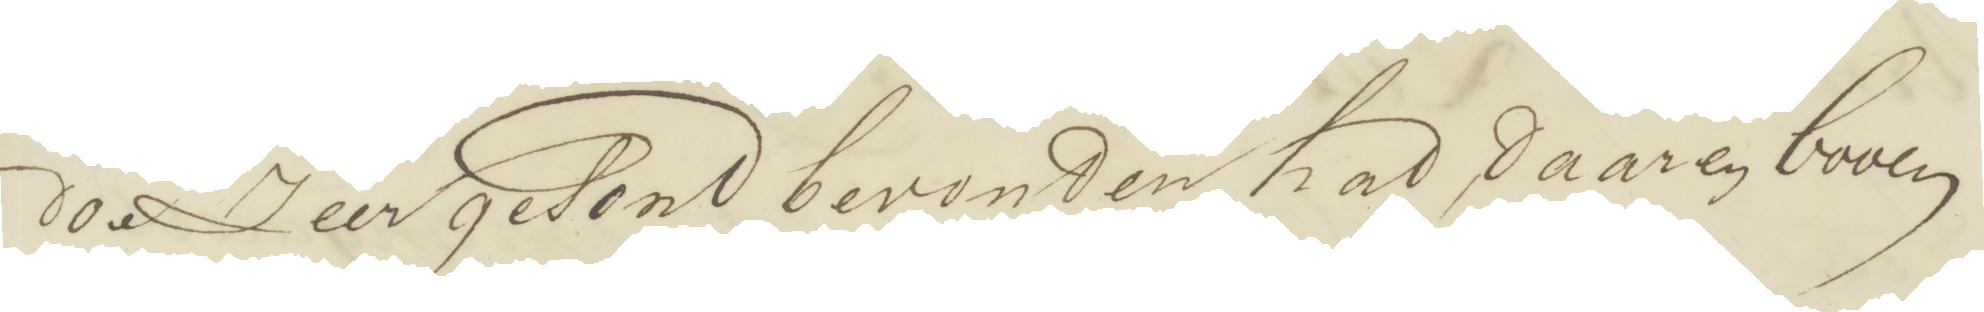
doe zeer gesond bevonden had, daaren boven
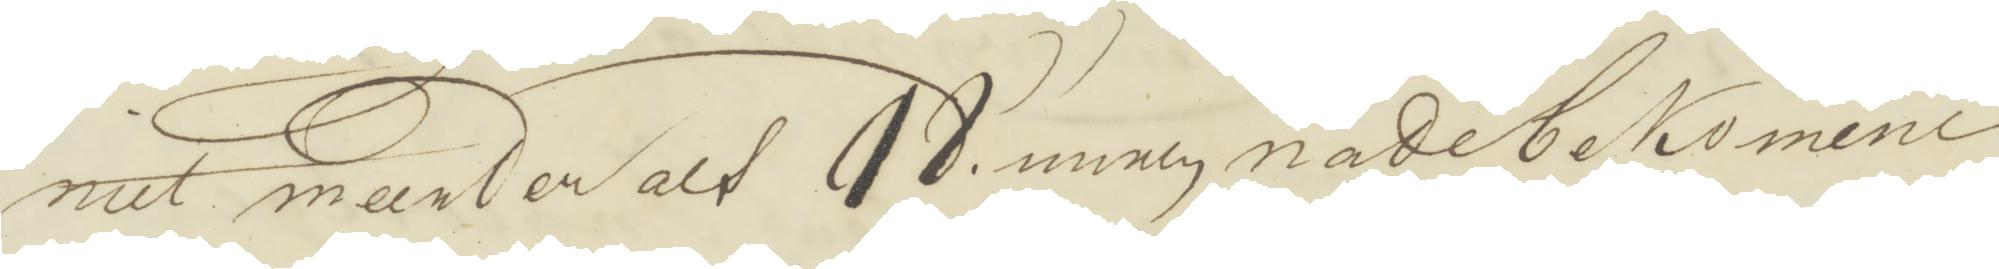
met meerder als 48. uuren na de bekomene
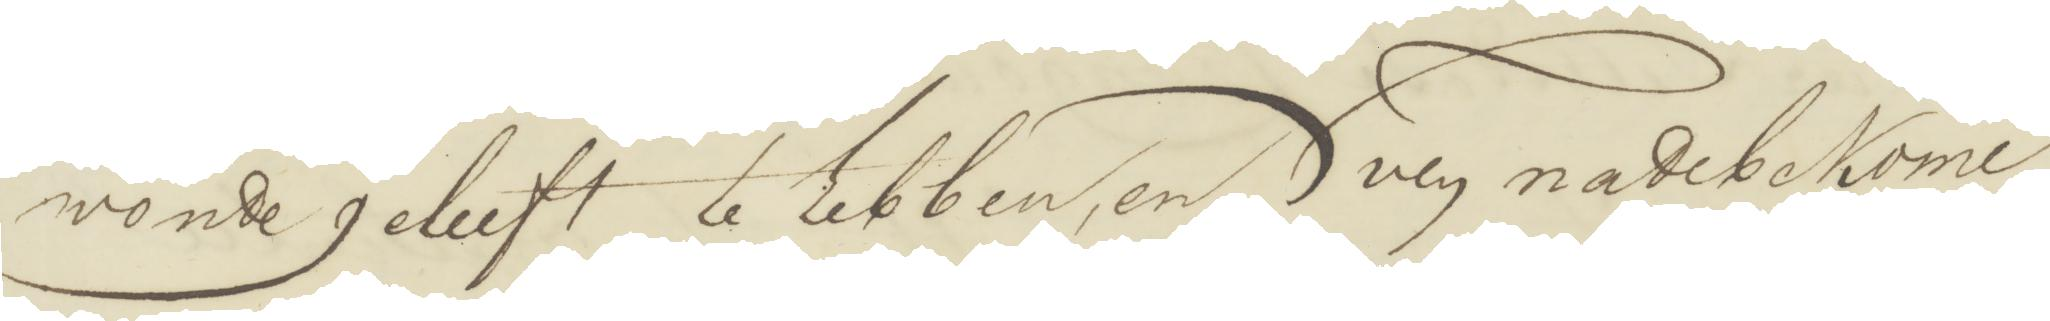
wonde geleeft te hebben, en Even na de bekome
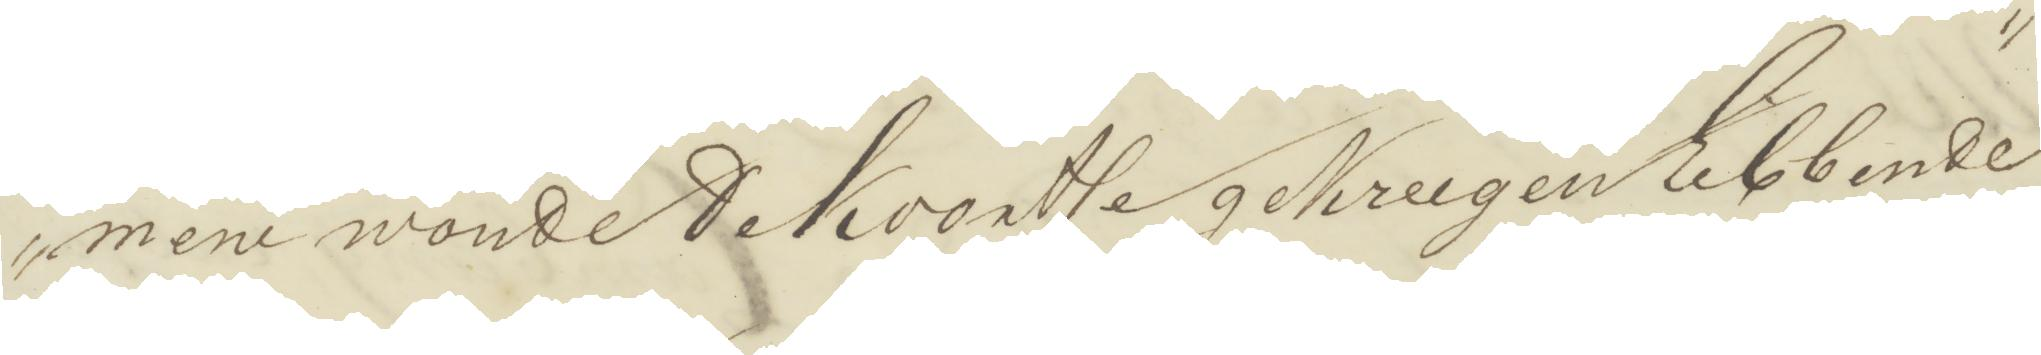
„mene wonde de koortse gekreegen hebbende,
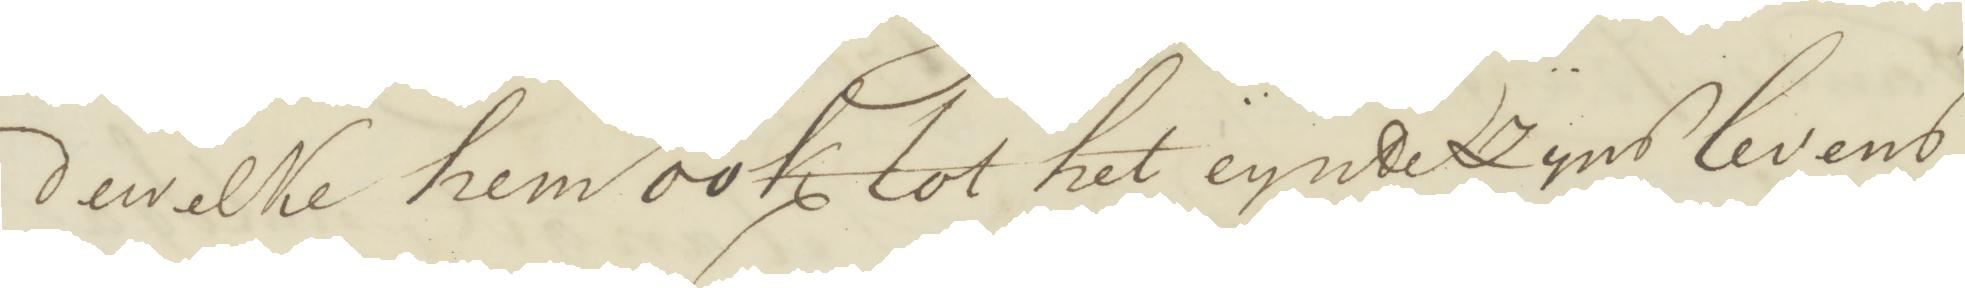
dewelke hem ook tot het eijnde zijns levens
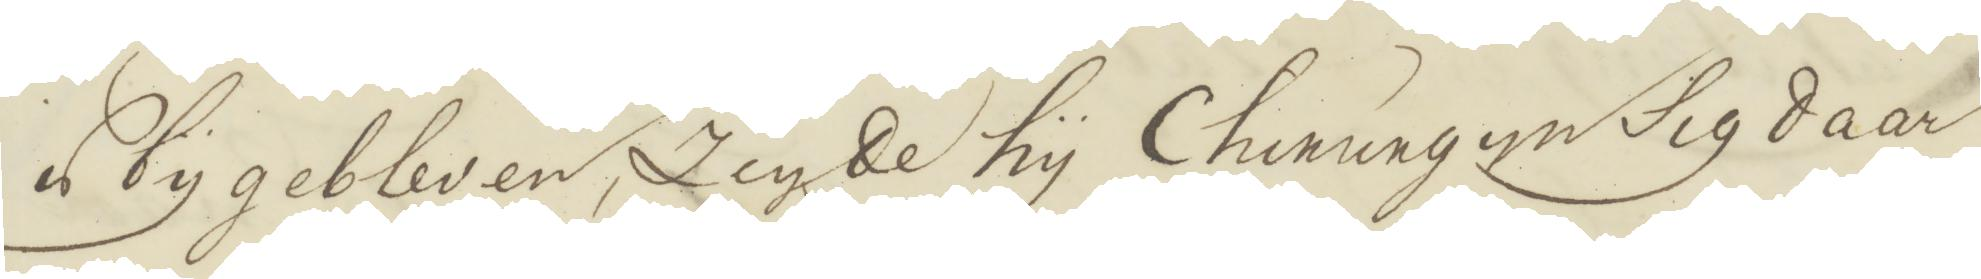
is bij gebleven, zeijde hij chirurgijn sig daar
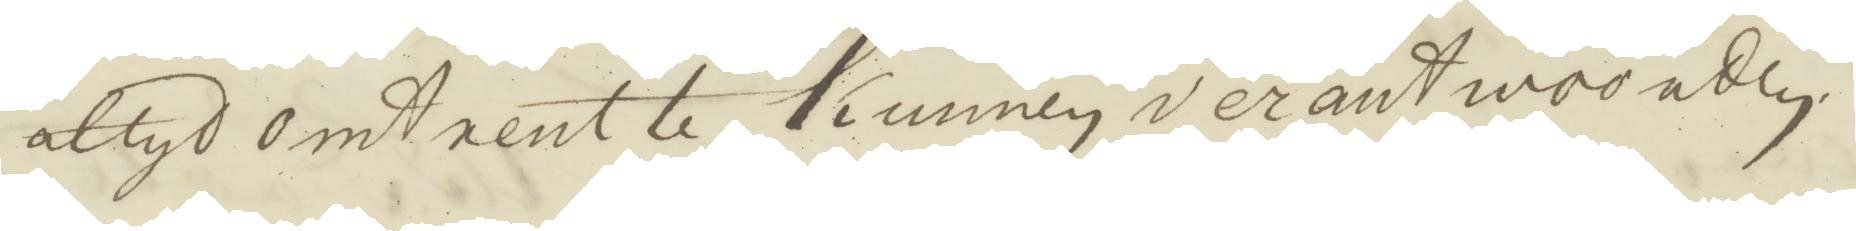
altijd omtrent te kunnen verantwoorden.
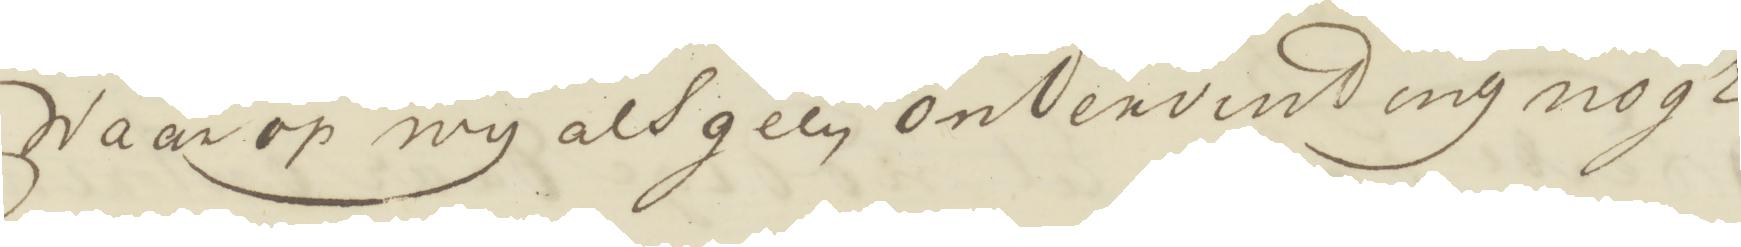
Waar op wij als geen ondervinding nogh
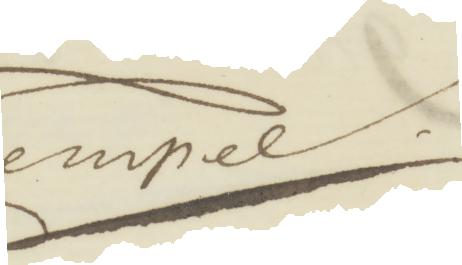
Exempel
